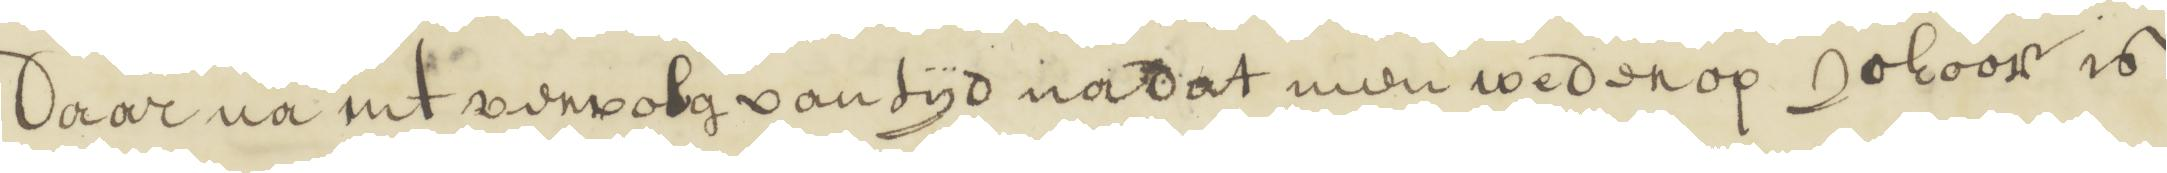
daar na in 't vervolg van tijd na dat men weder op johoor is
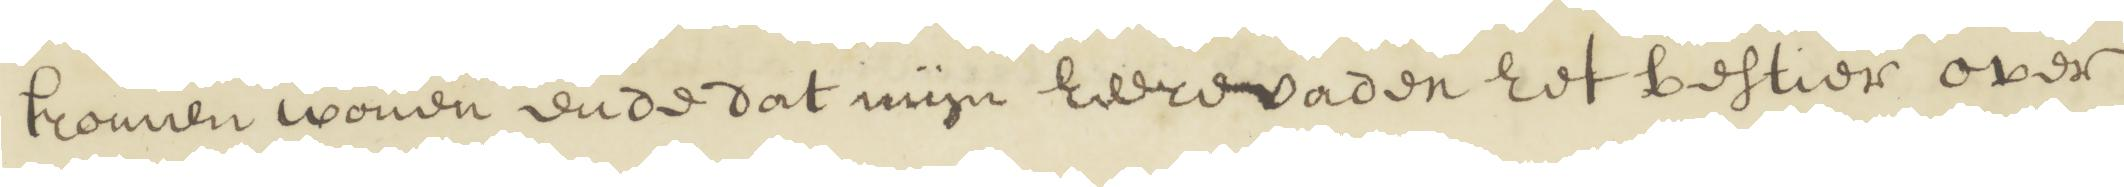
komen wonen ende dat mijn heerevader het bestier over
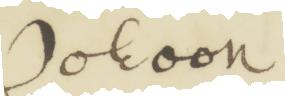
Johoor
